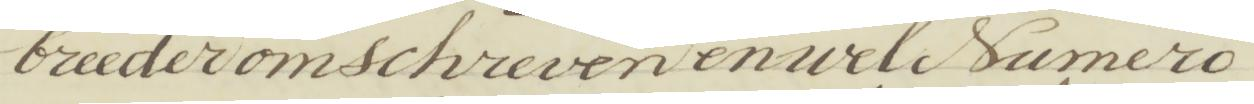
breeder omschreven en wel Numero
